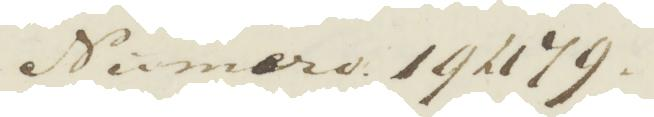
Numero: 19479.
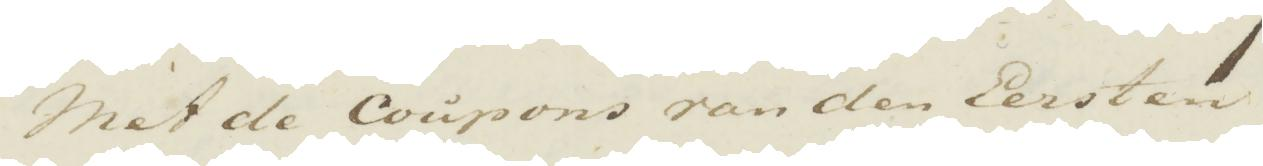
Met de coupons van den Eersten
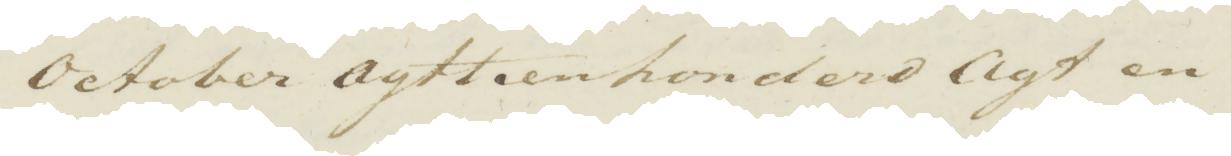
October agttienhonderd Agt en
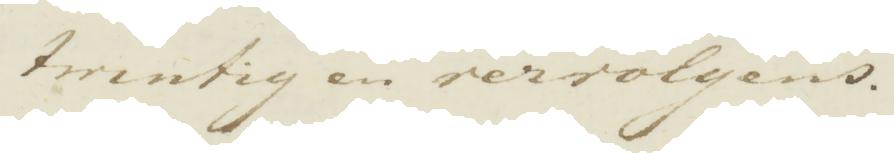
twintig en vervolgens.
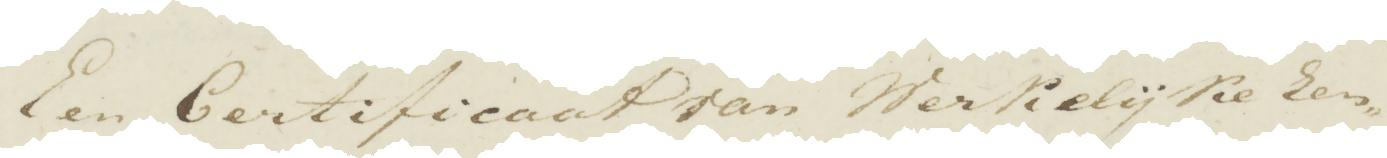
Een Certificaat van Werkelijke ren„
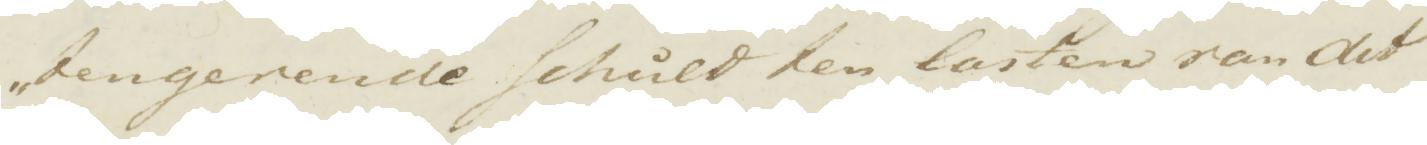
„tengevende schuld ten lasten van dit
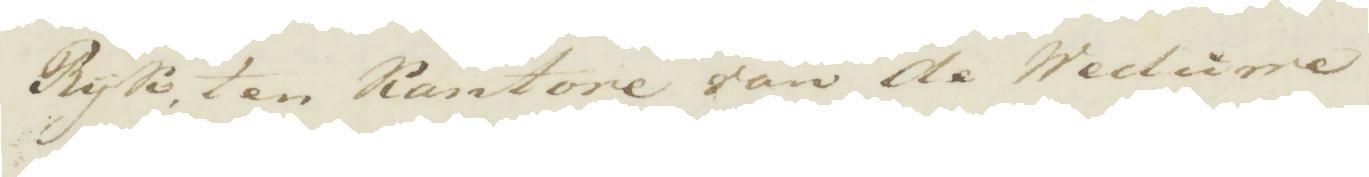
Rijk, ten Kantore van de Weduwe
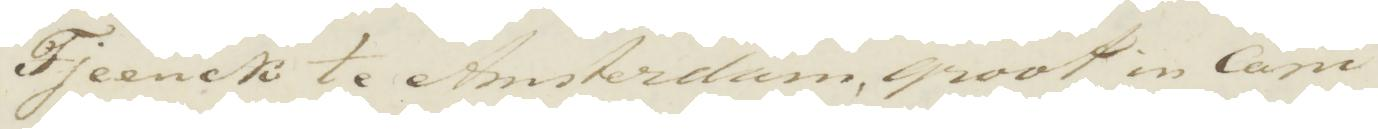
Tjeenck te Amsterdam, groot in Capi
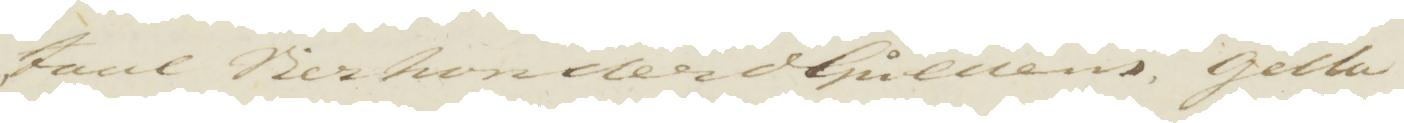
taal vierhonderd Guldens, geda
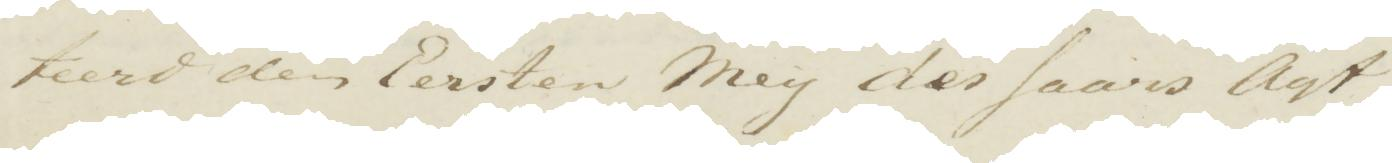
teerd den Eersten Mey des Jaars Agt
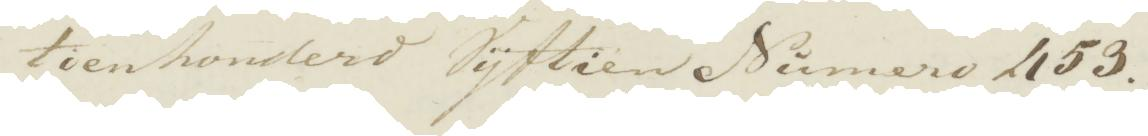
tienhonderd Vijftien Numero 453.
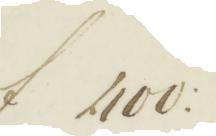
ƒ400: _
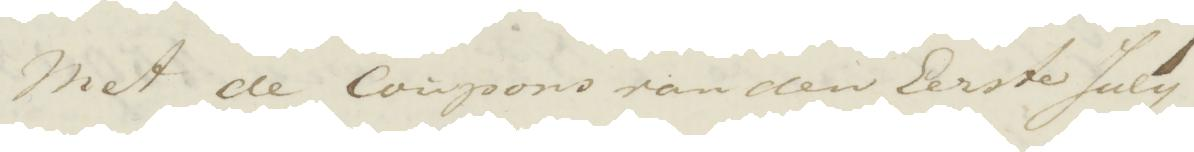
Met de Coupons van den Eerste July
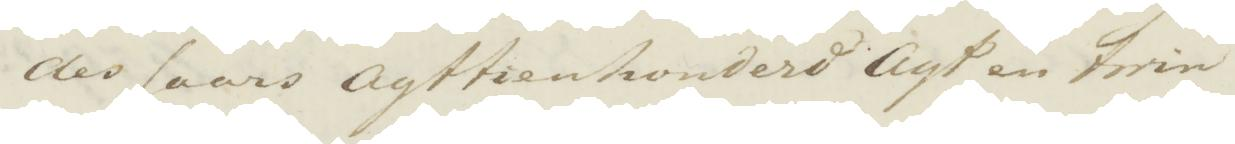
des Jaars agttienhonderd Agt en twin
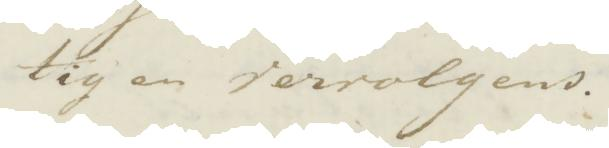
tig en vervolgens.
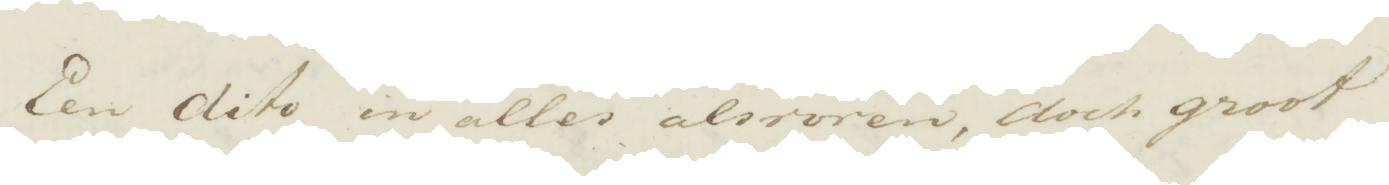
Een dito in alles alsvoren, doch groot
